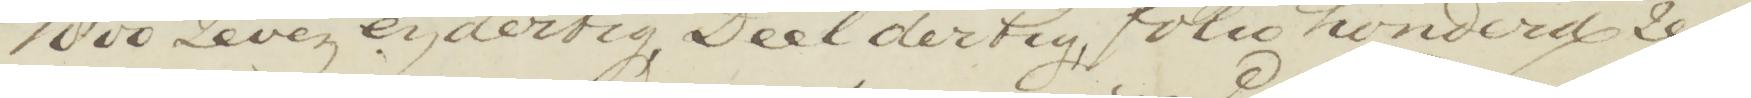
1800 zeven en dertig Deel dertig, folio honderd zes
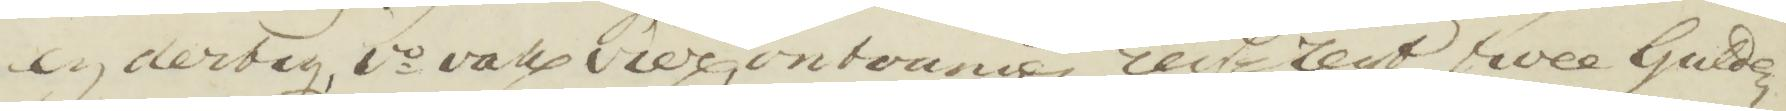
en dertig v=o vak vier ontvangen reg=e regt twee Gulden
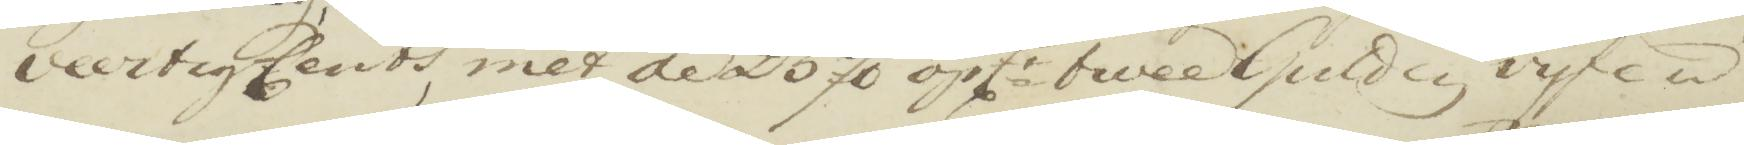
Veertig Cents met de 23%0 opC=t twee Gulden vyf en
